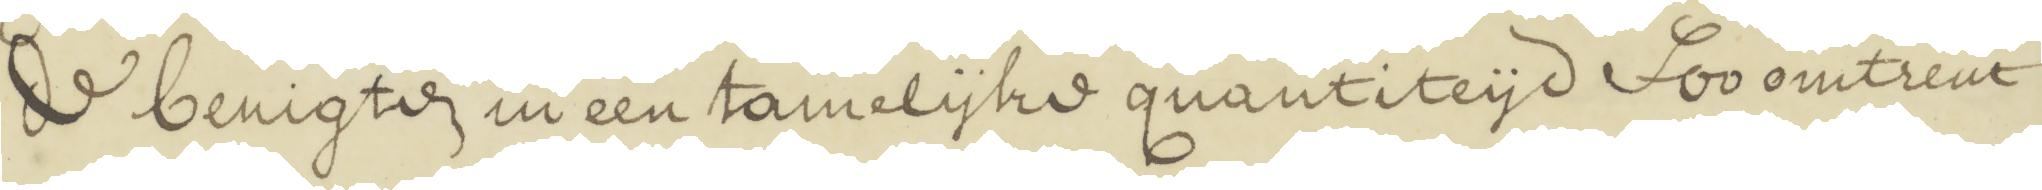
de berigten in een tamelijke quantiteijd soo omtrent
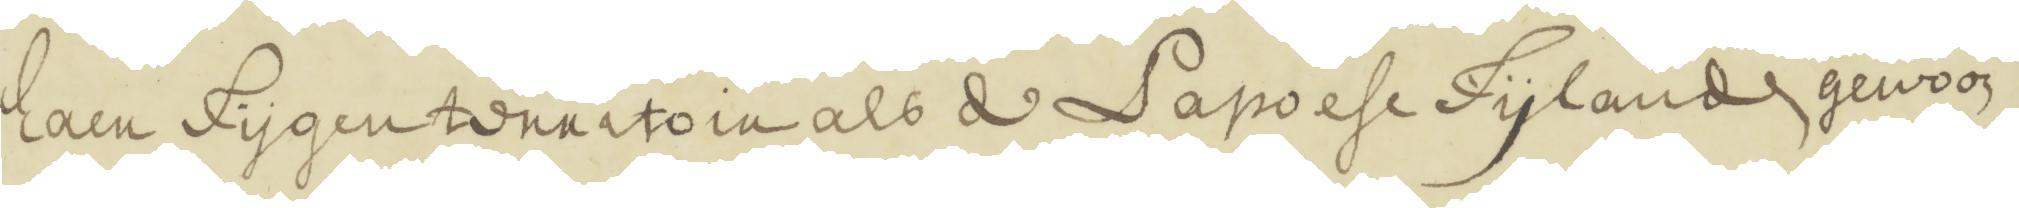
haer Eijgen territoir als de Sapoese Eijlanden gewoon
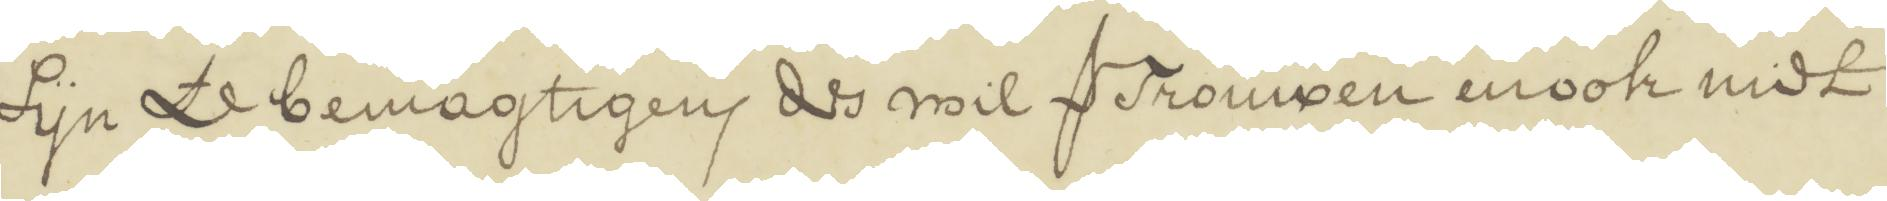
sijn te bemagtigen, des wil vertrouwen en ook niet
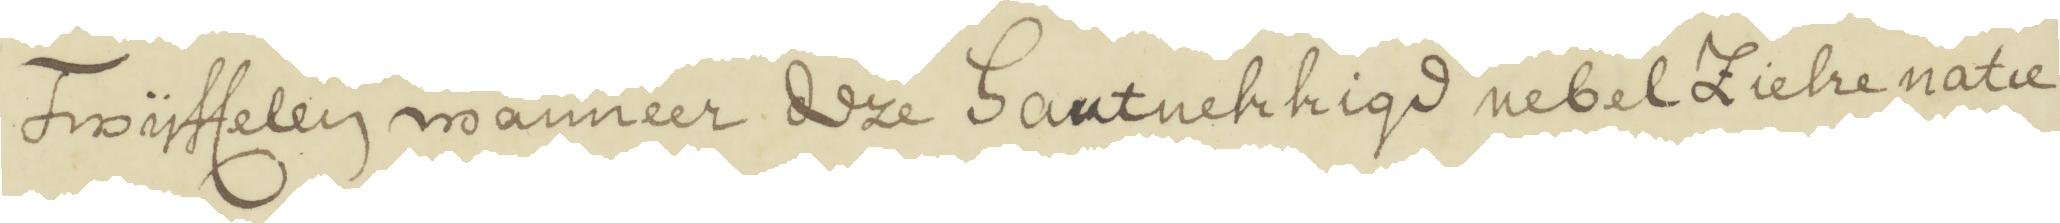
Twijffelen wanneer deze hartnekkige rebel zieke natie
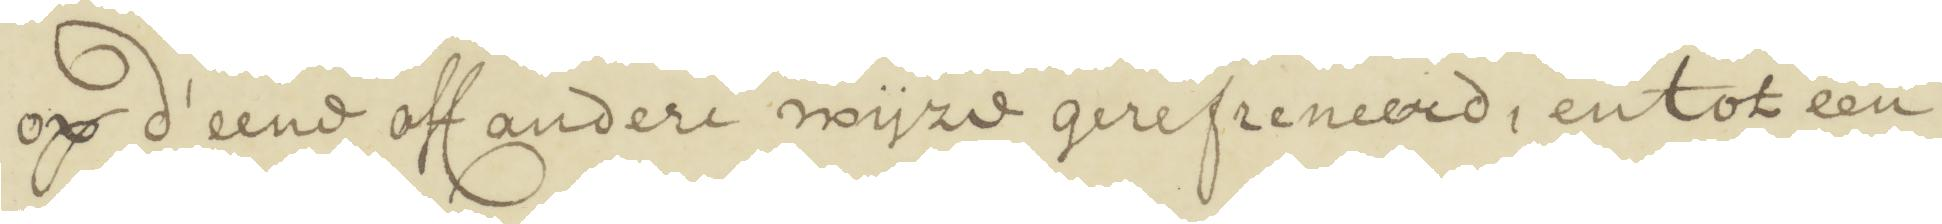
op d’eene off andere wijze gerefreneerd, en tot een
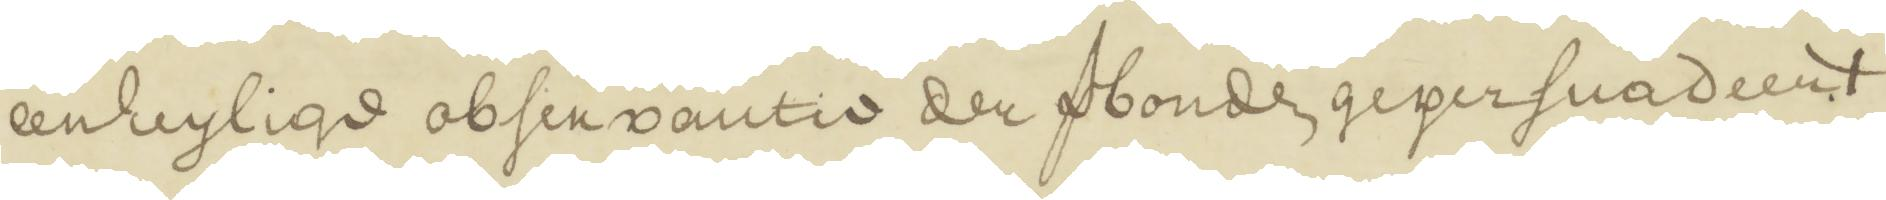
een heylige observantie der verbonden gepersuadeert
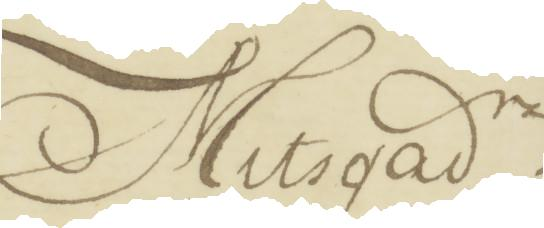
Mitsgadrs
